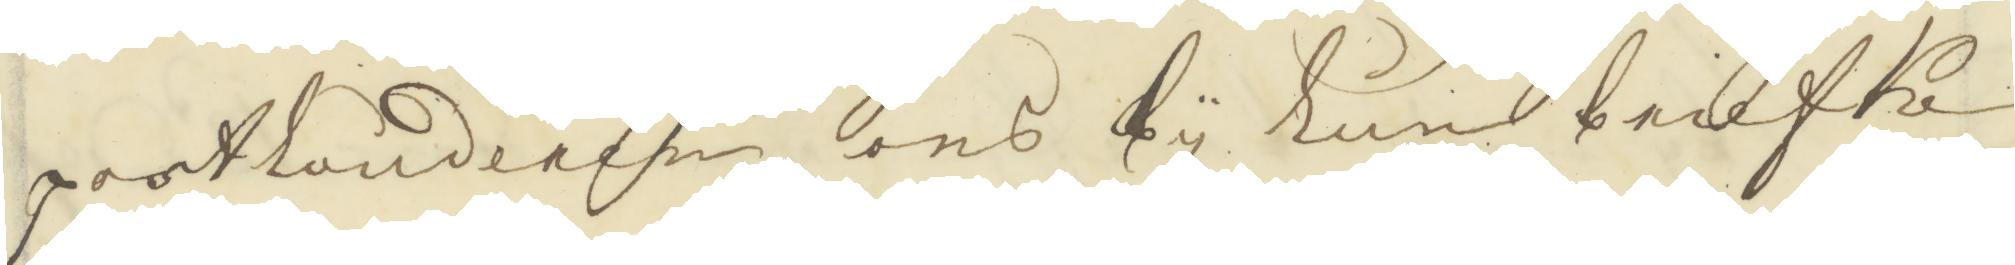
posthouderen ons bij hun briefke
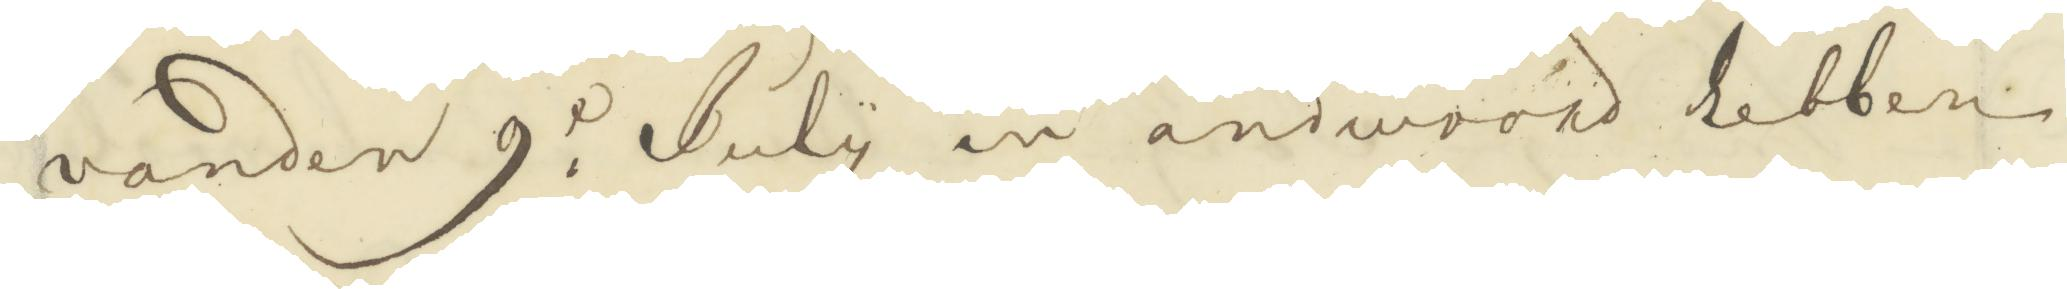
vanden 9„e Julij in andwoord hebben
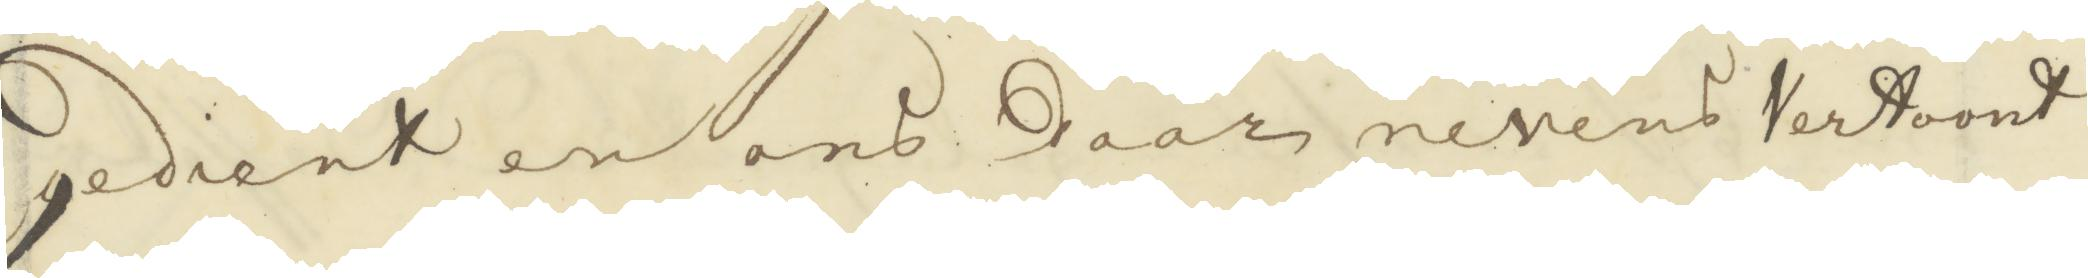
gedient en ons daar, nevens vertoont
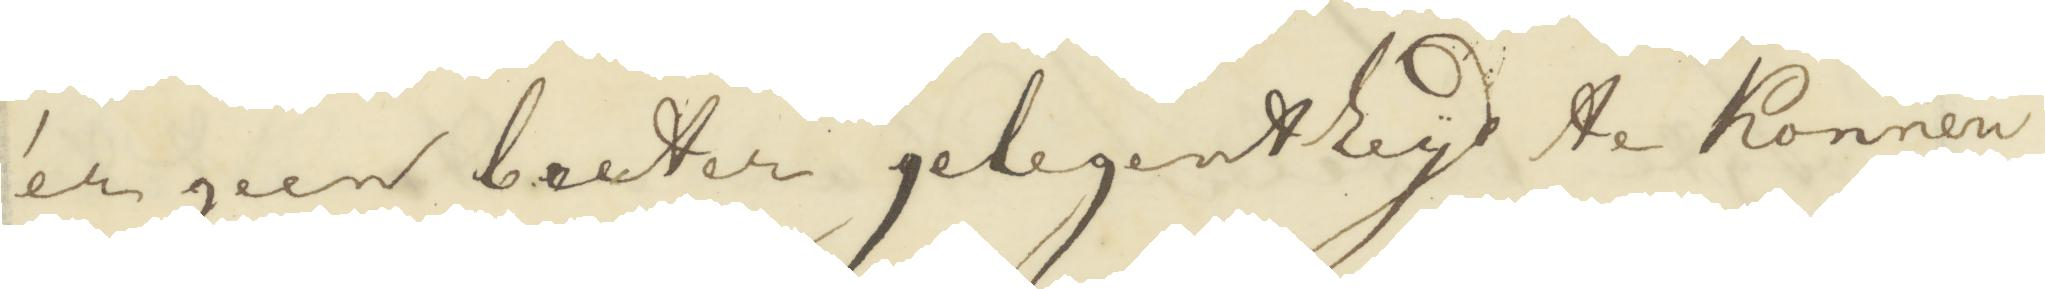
'er geen beeter gelegentheijd te konnen
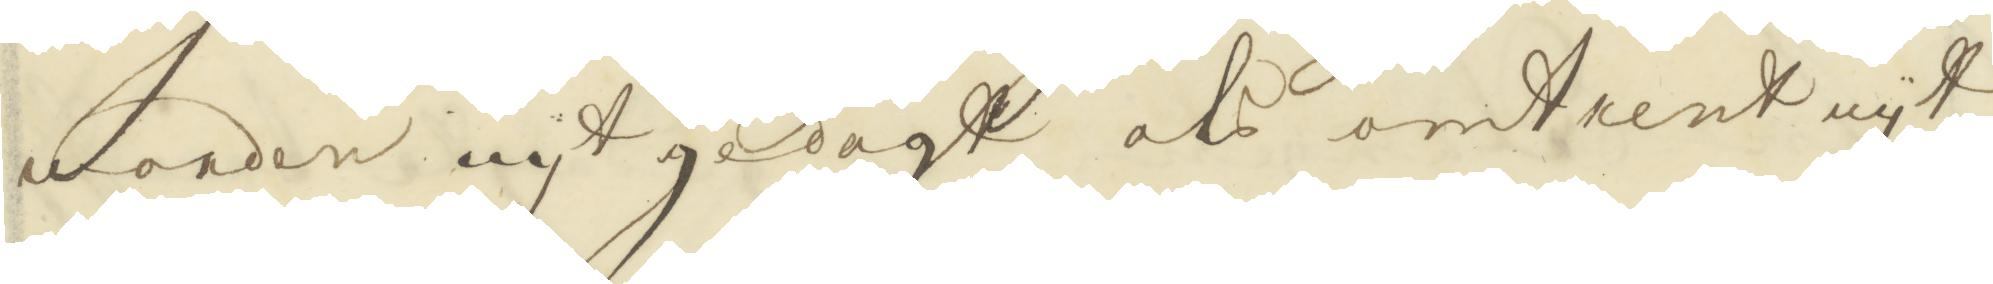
worden uijt gedagt als omtrent uijt
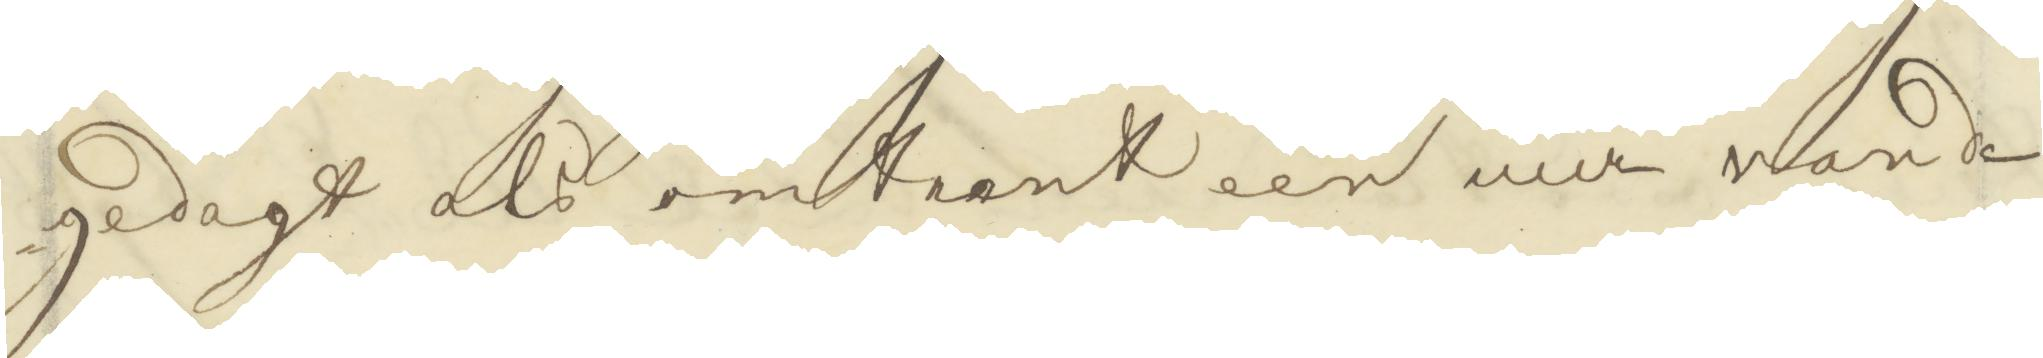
„gedagt als omtrent een uur van de
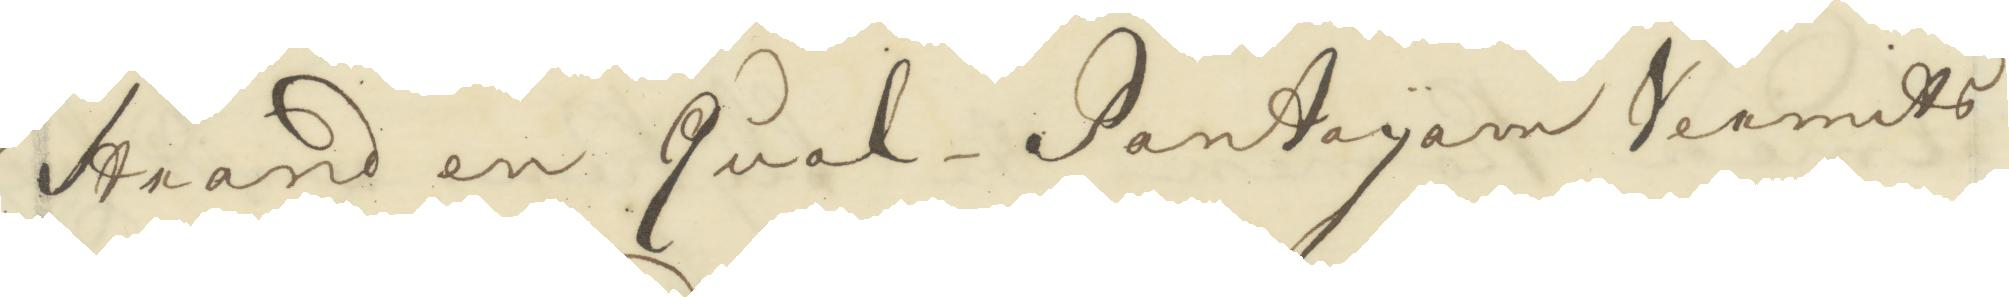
strand en Qual-Pantaijam vermits
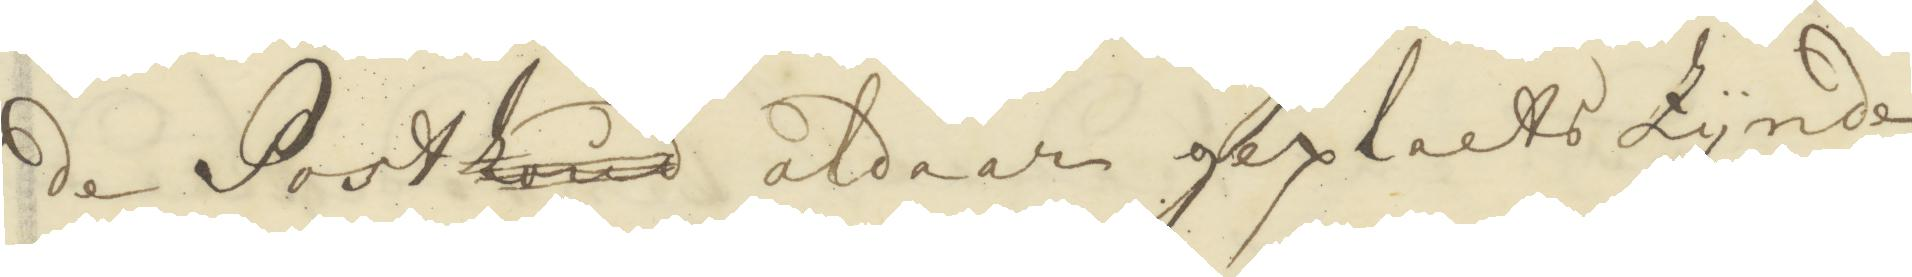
de Posthoud aldaar geplaets zijnde
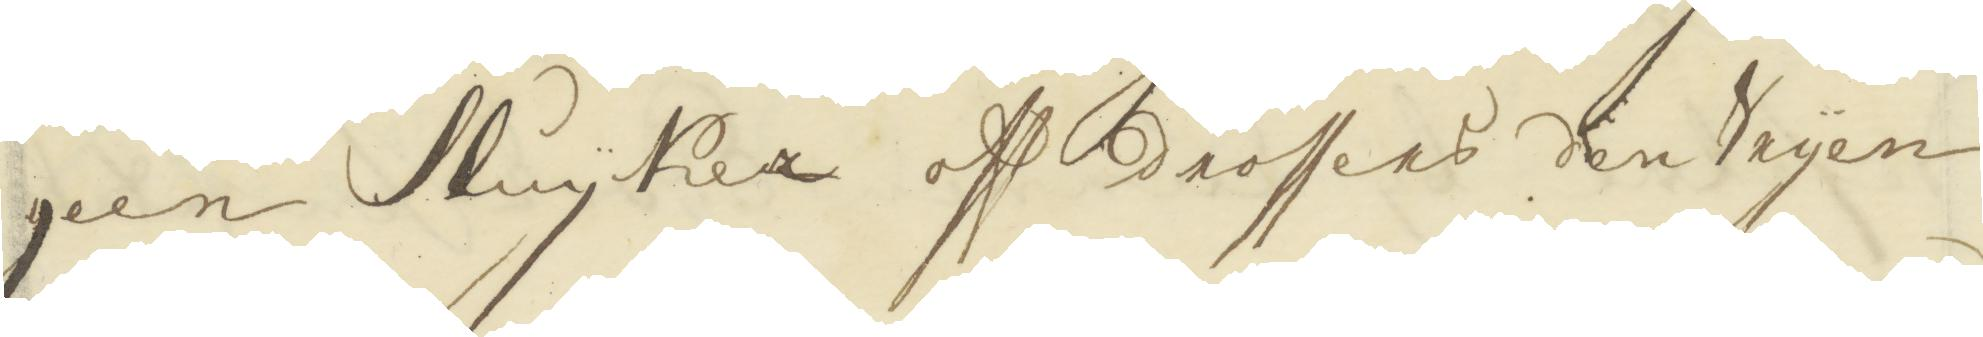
geen sluijker of drossers ten vrijen
